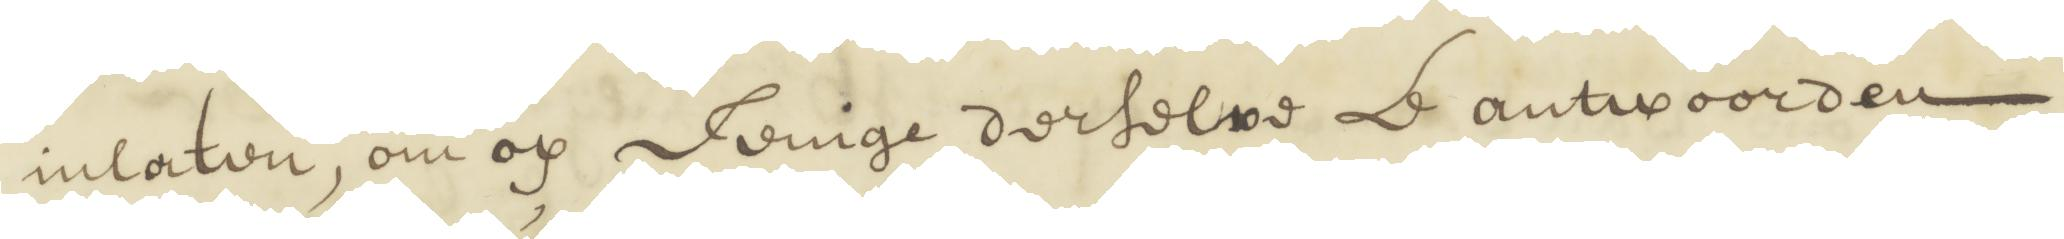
inlaten, om op Eenige derselve te antwoorden
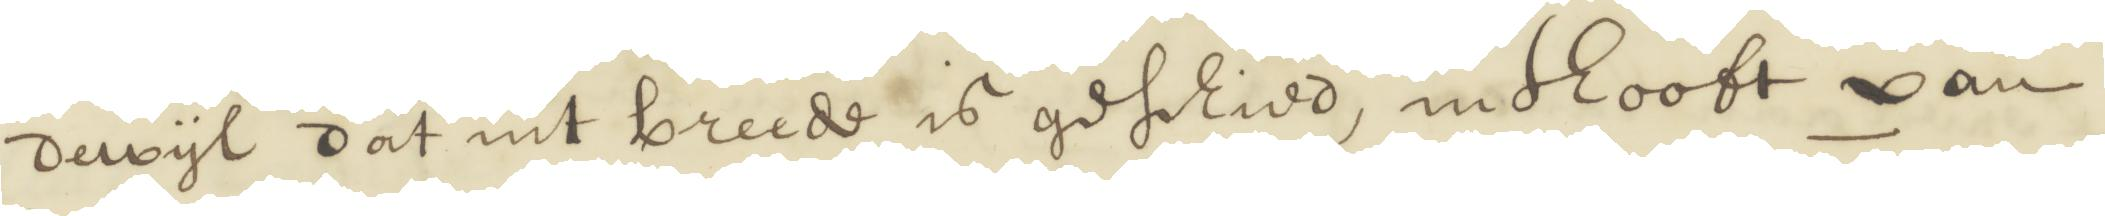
dewijl dat in't breede is geschied, in 'thooft van
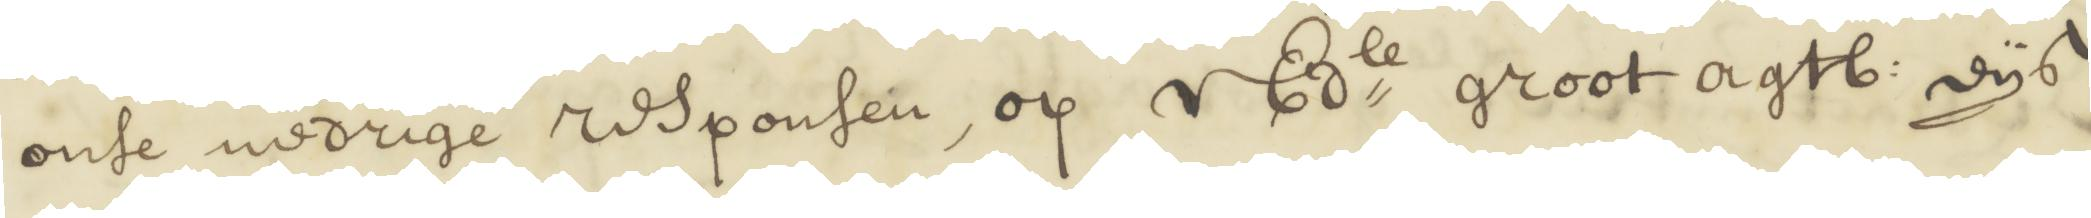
onse nedrige responsen, op vEd„le groot agtb: eijs
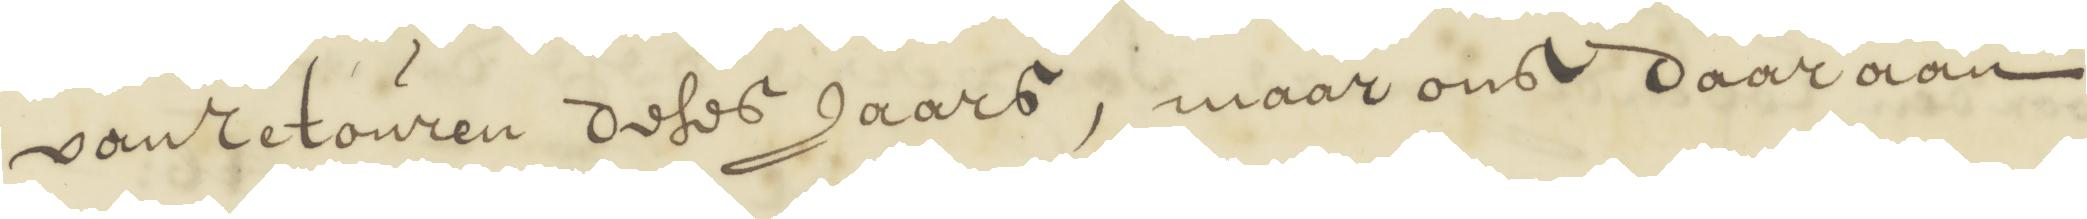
van retouren deses Jaars, maar ons daar aan
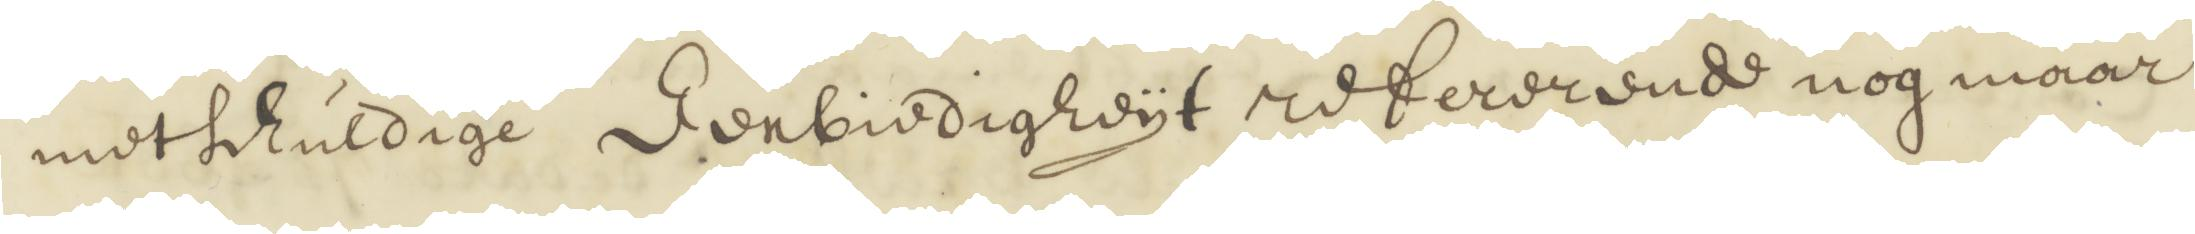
met schuldige Eerbiedigheijt refererende nog maar
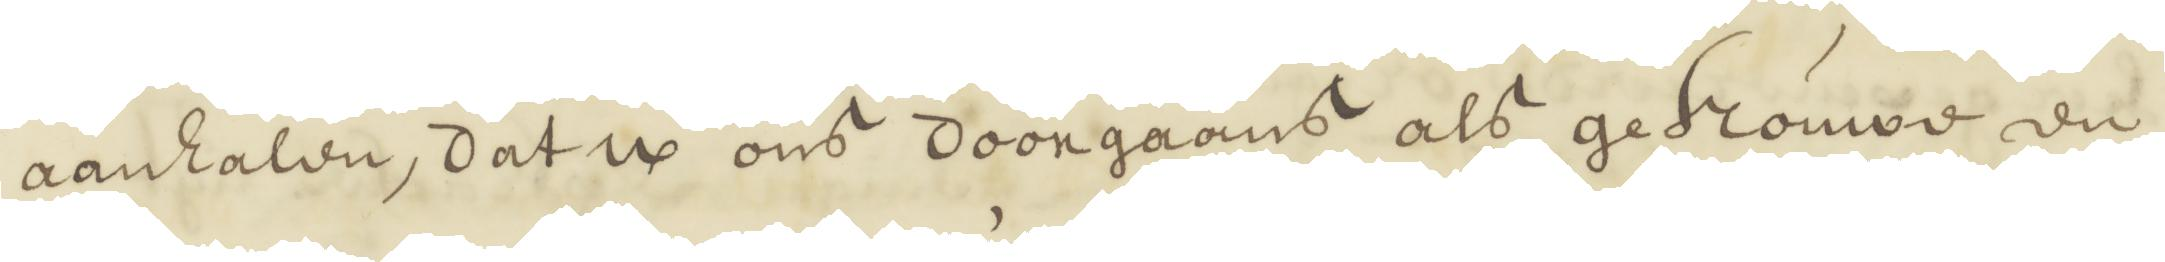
aanhalen, dat w' ons doorgaans als getrouwe en
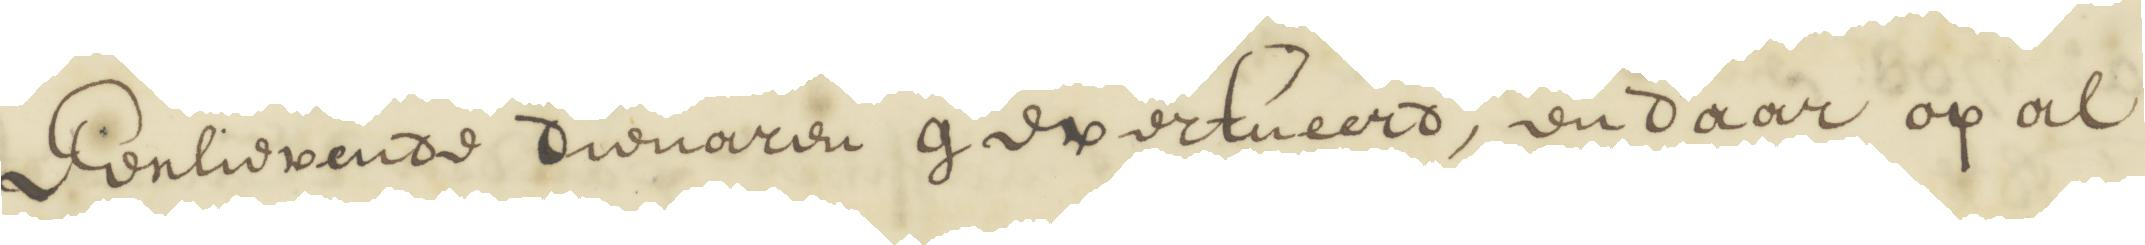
Eerlievende dienaren g'evertueerd, en daar op al
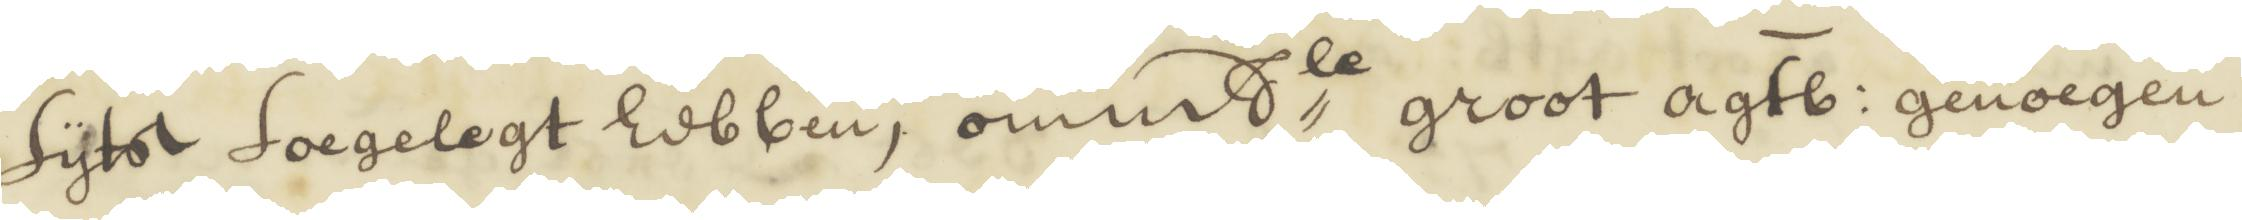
tijts toegelegt hebben, om uEd„le groot agtb: genoegen
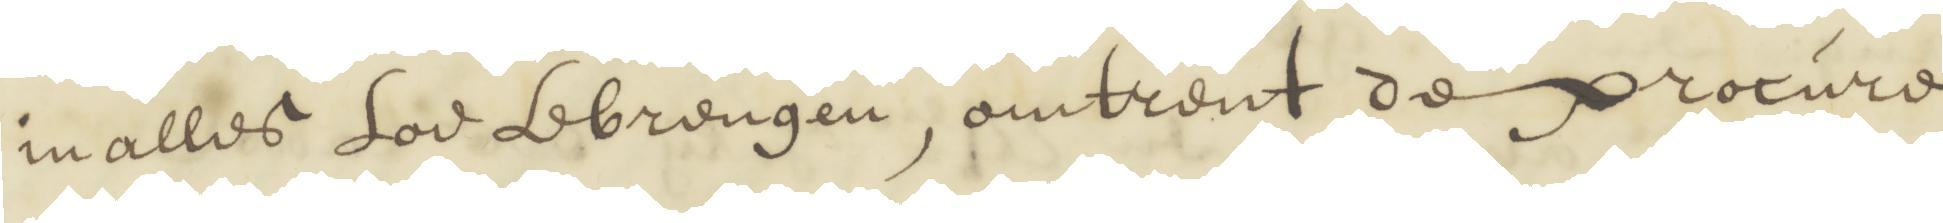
in alles toe te brengen, omtrent de procure
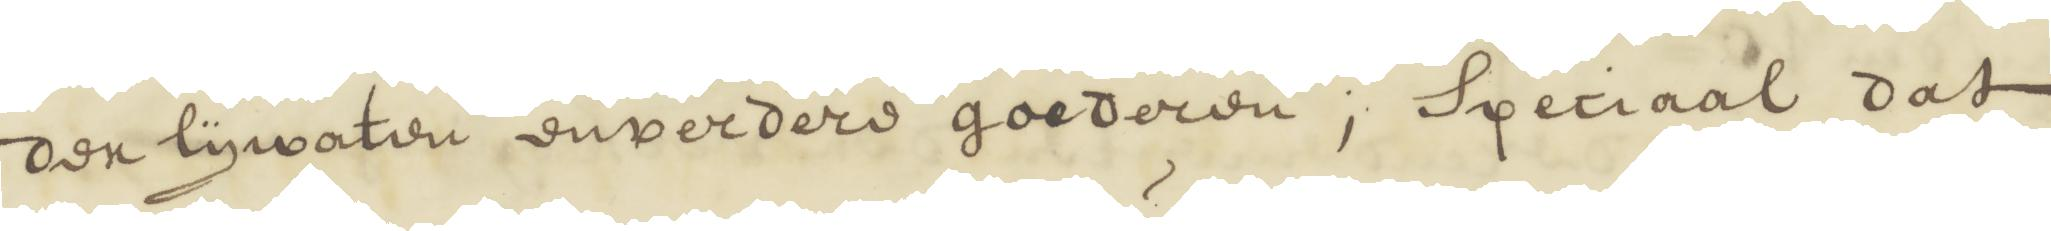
der lijwaten enverdere goederen; Speciaal dat
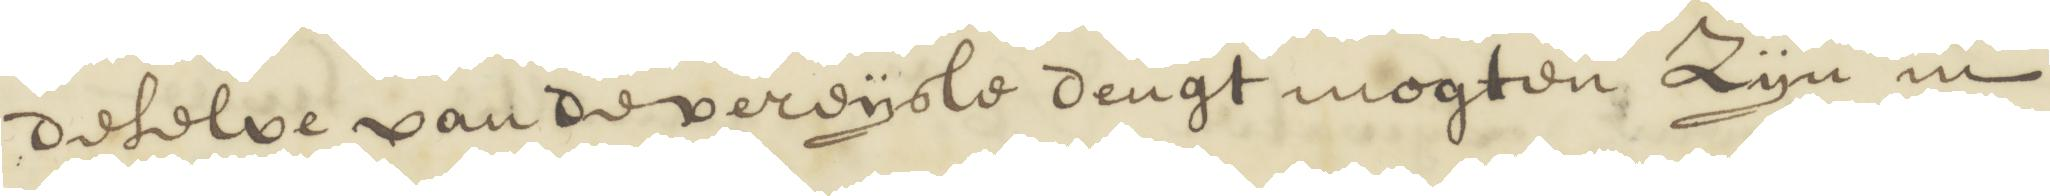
deselve van de vereijste deugt mogten Zijn in
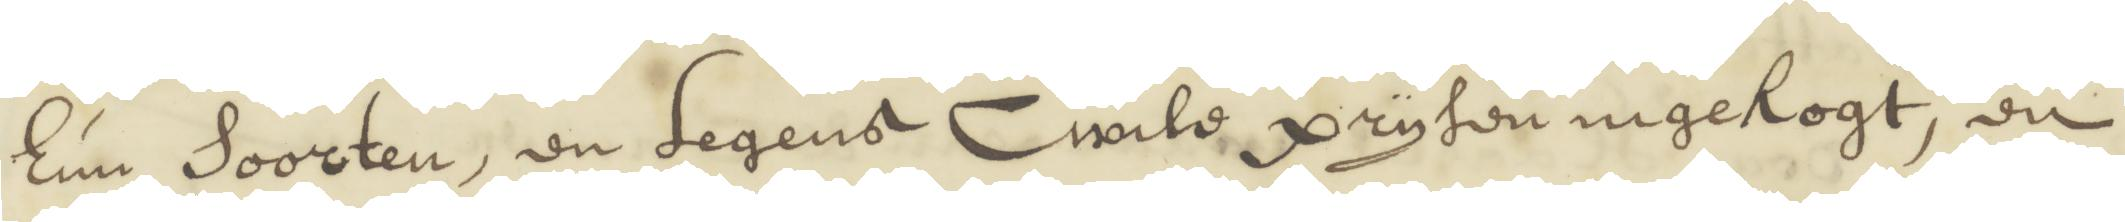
hun soorten, en tegens Civile prijsen ingekogt; en
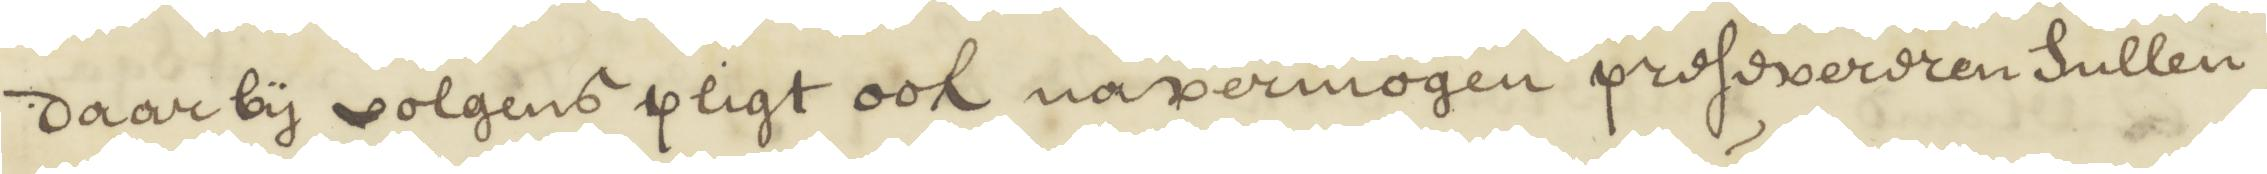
daar bij volgens pligt ook na vermogen presevereren sullen
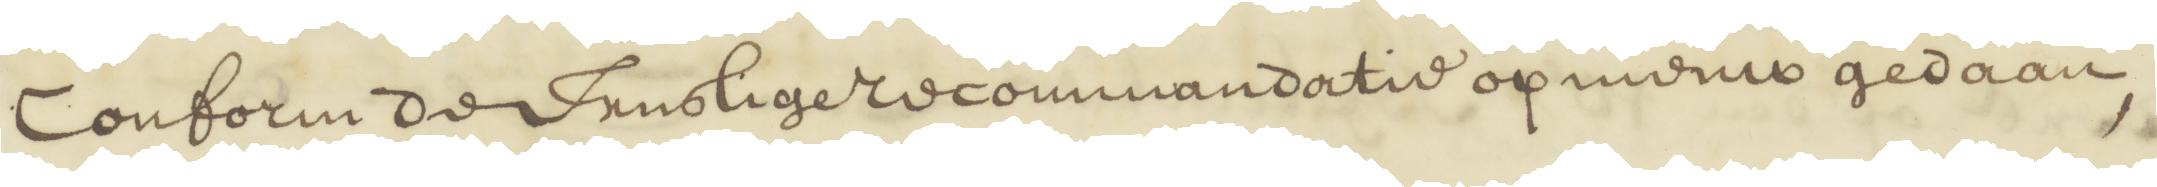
conform de Ernstige recommandatie op nieuw gedaan,
